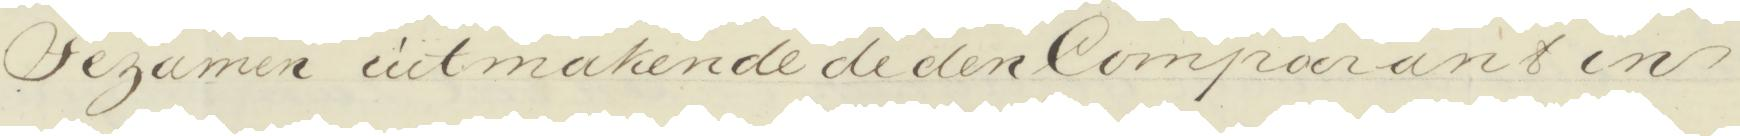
Tezamen uitmakende de den Comparant in
